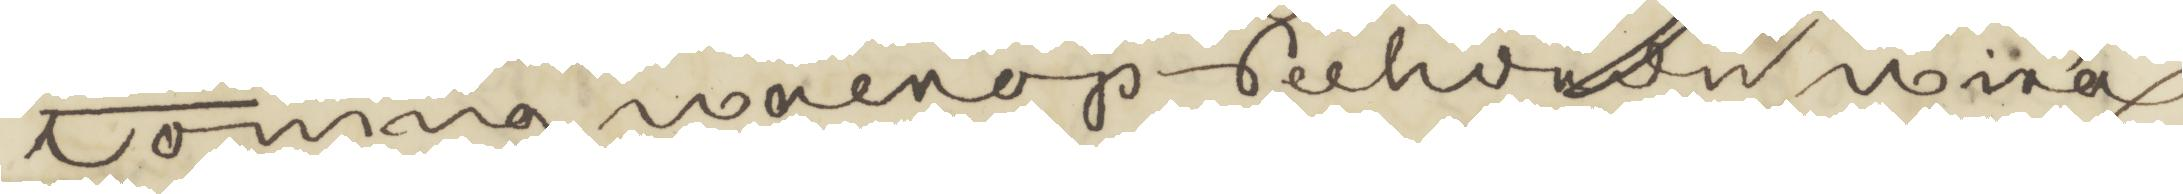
Coning waerop seekeren wira
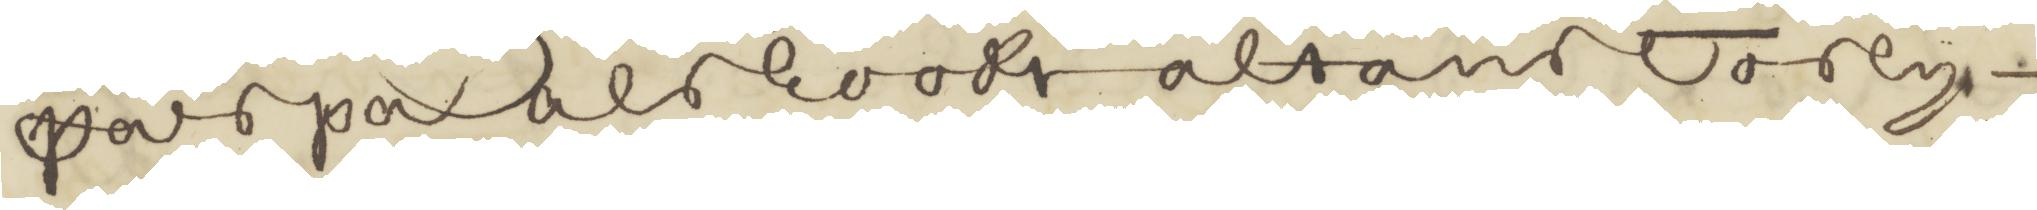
poespa als hooft altans Costij —
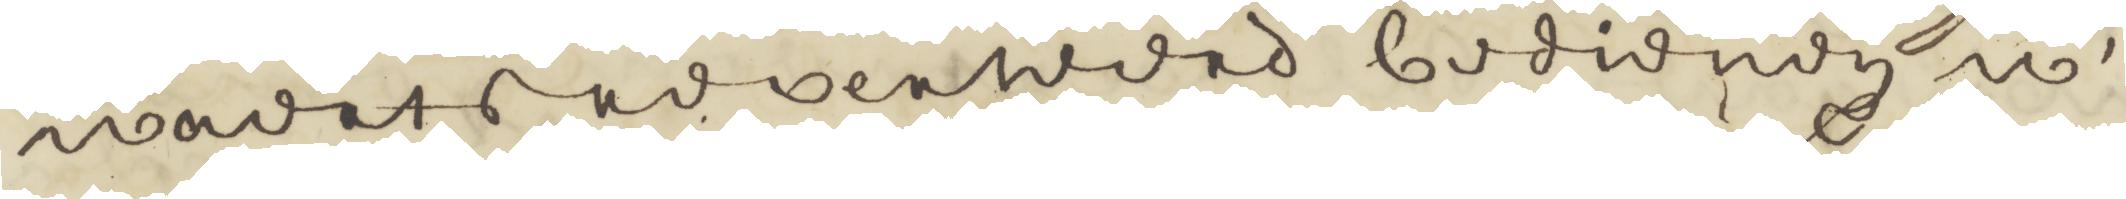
waerts reverteerd bedienen w'
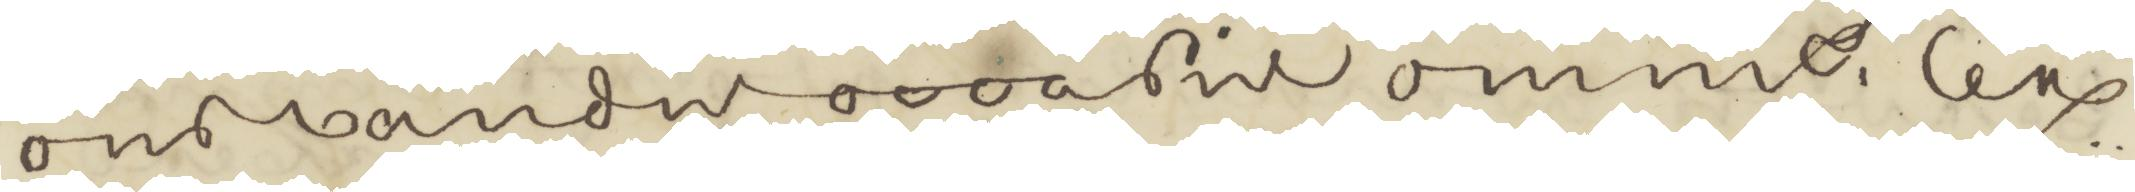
ons vandie occasie om uE: ter
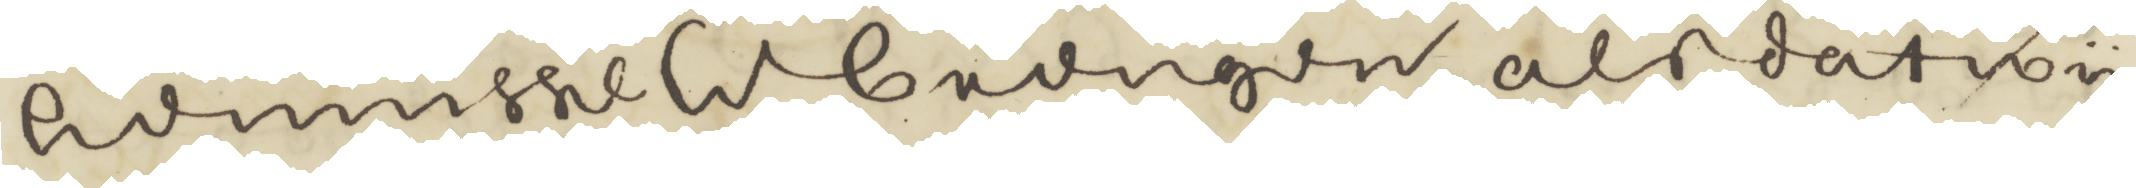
kennisse te brengen als dat wij
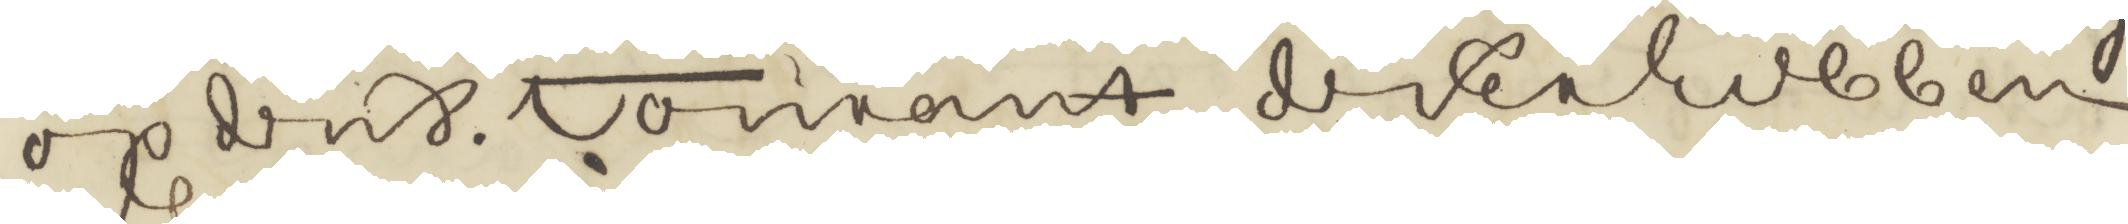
op den 8. Courant de Eer hebben
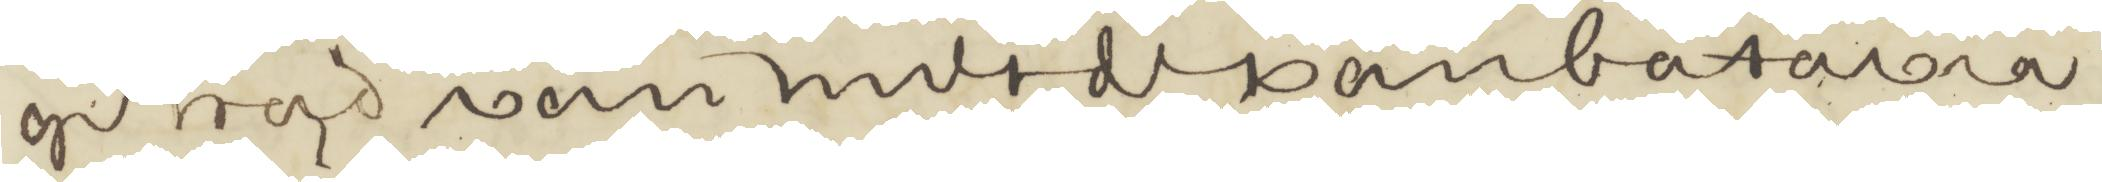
gehad van met de van batavia
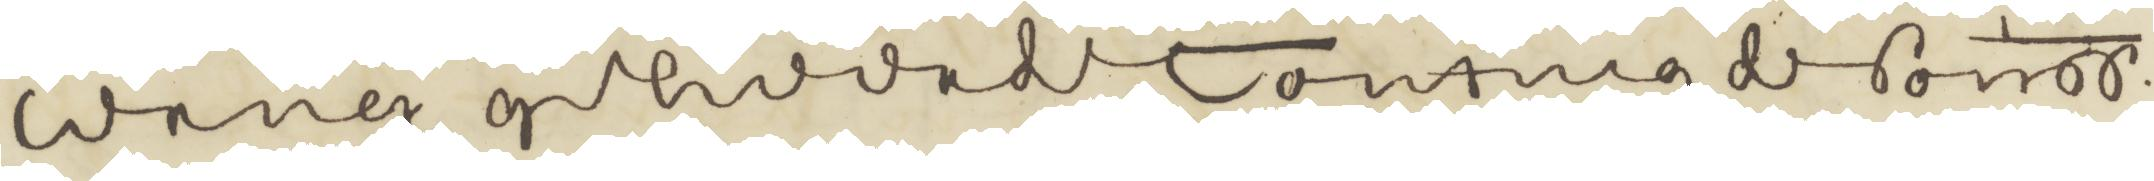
terug gekeerde Conting de souss.
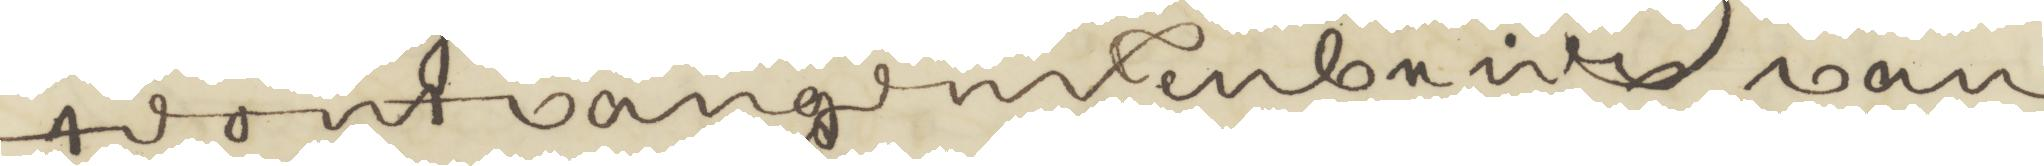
te ontvangen Een briev van
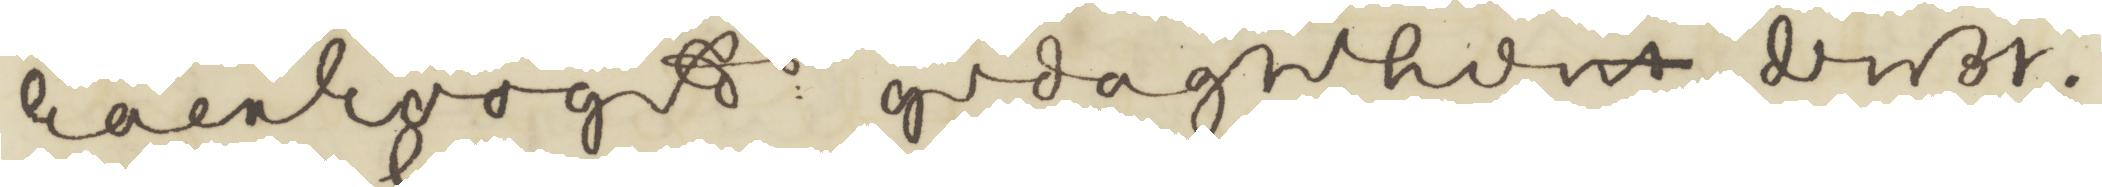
haer hoogEd: gedagtekent den 31.
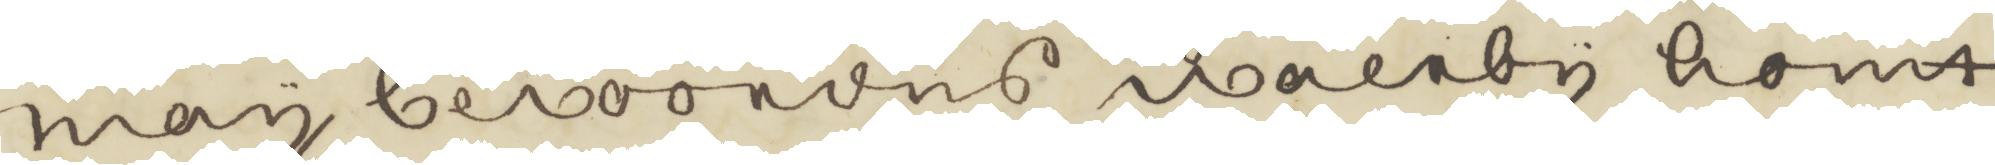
maij bevoorens waerbij komt
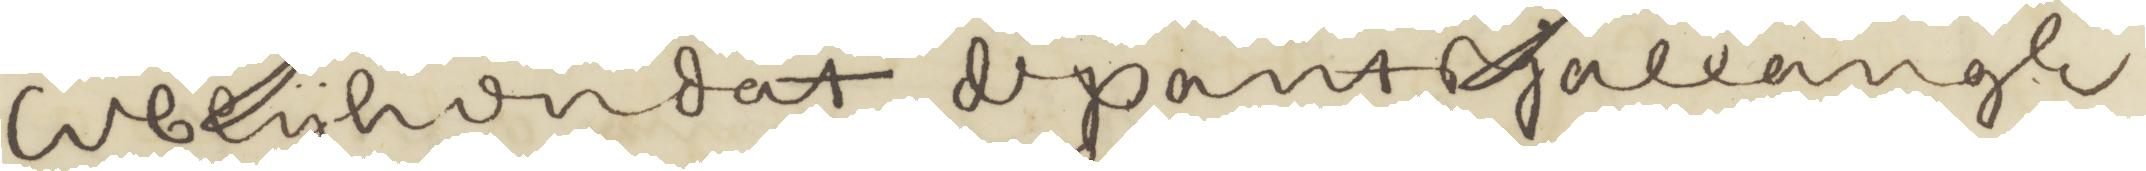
te blijken dat de Pantsjallangh
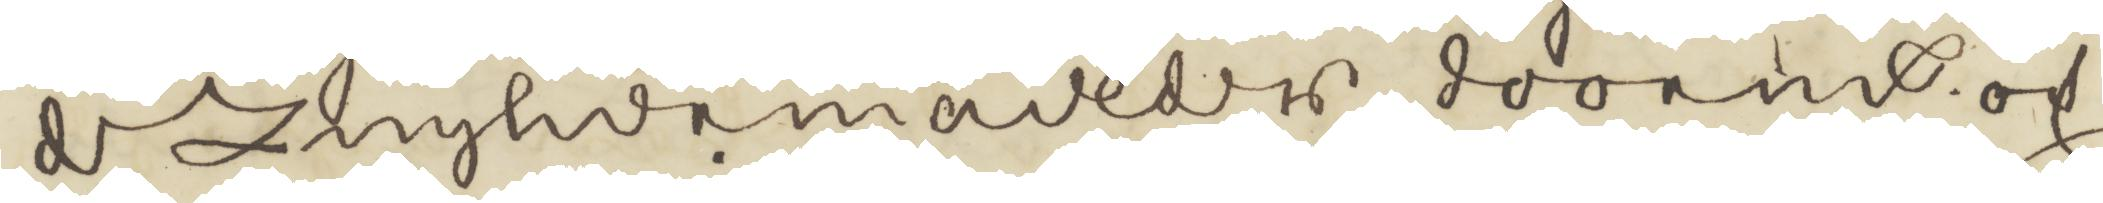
de Zuykermaelder door uE. op
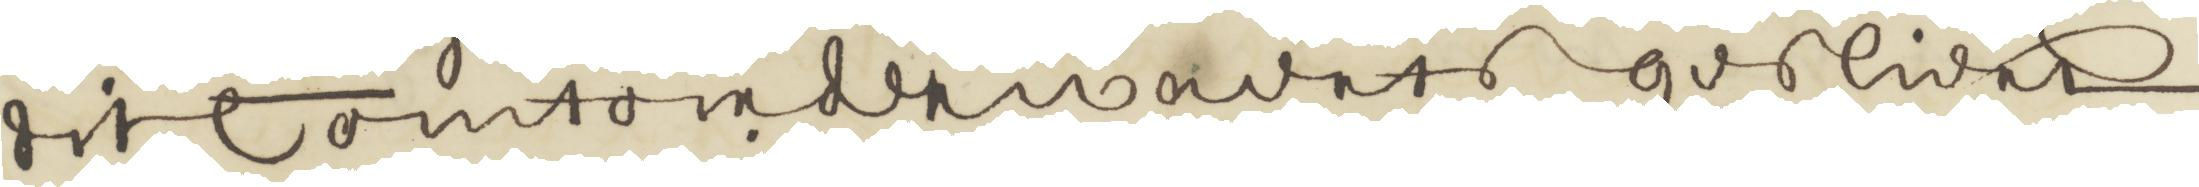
dit Comtoir derwaerts gestiert
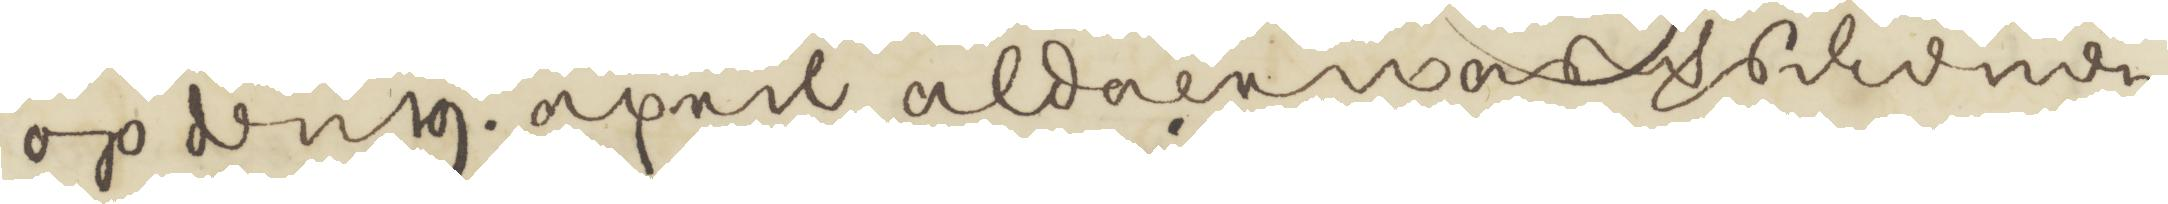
op den 19. april aldaer was verschenen
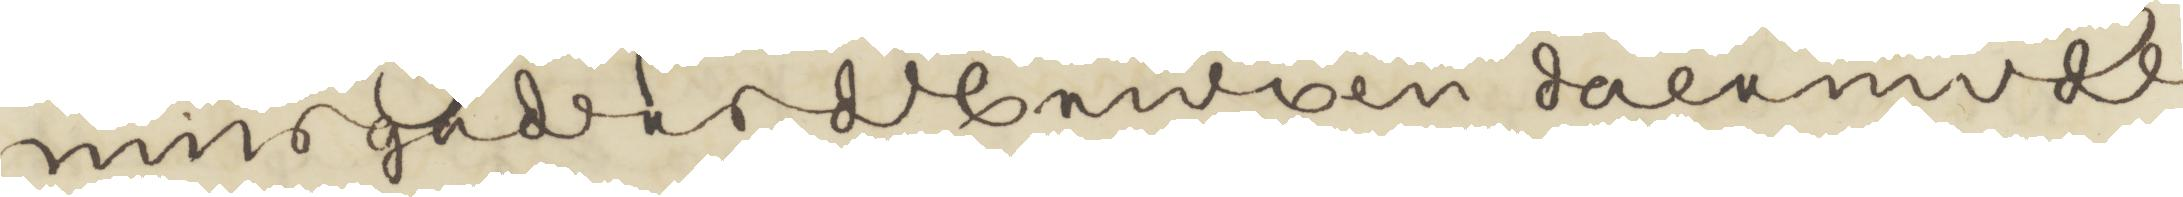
mitsgaders de brieven daermede
